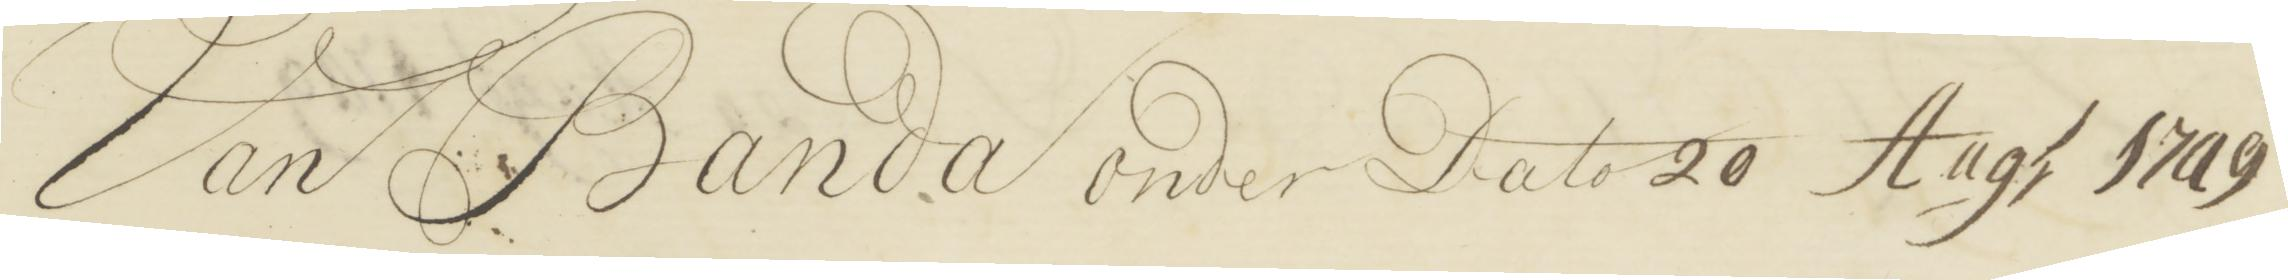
Van Banda onder Dato 20 Aug,s 1749
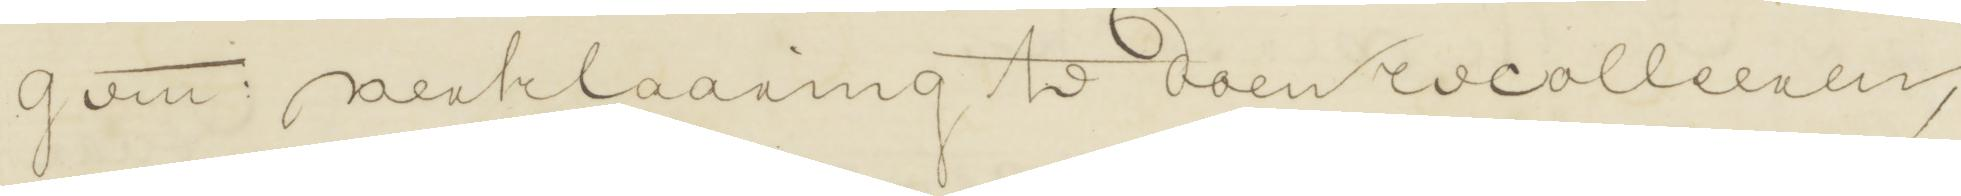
gem: verklaaring te doen recolleeren,
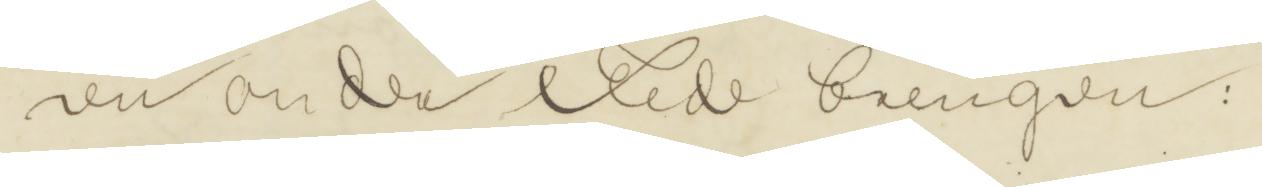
en onder Eede brengen:
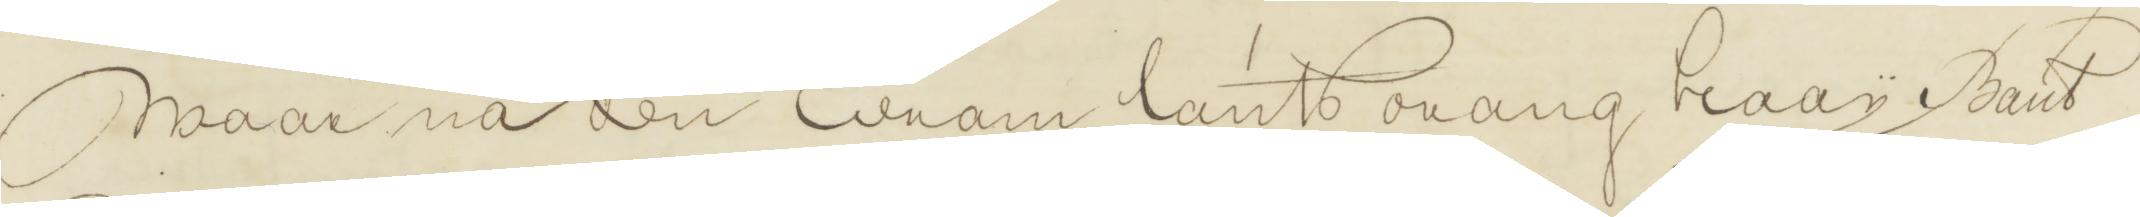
waar na den Ceram lauts orang kaaij Baut
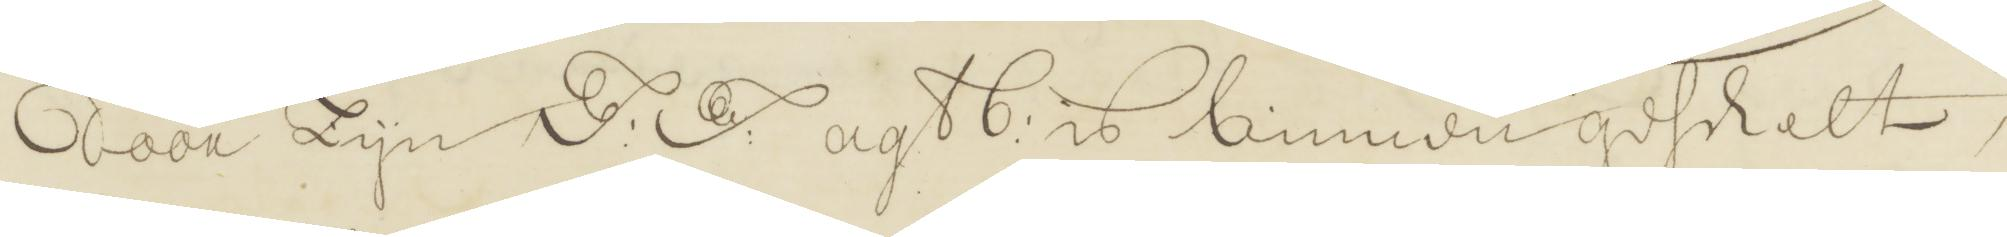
door zijn E: E: agtb: is binnen geschelt,
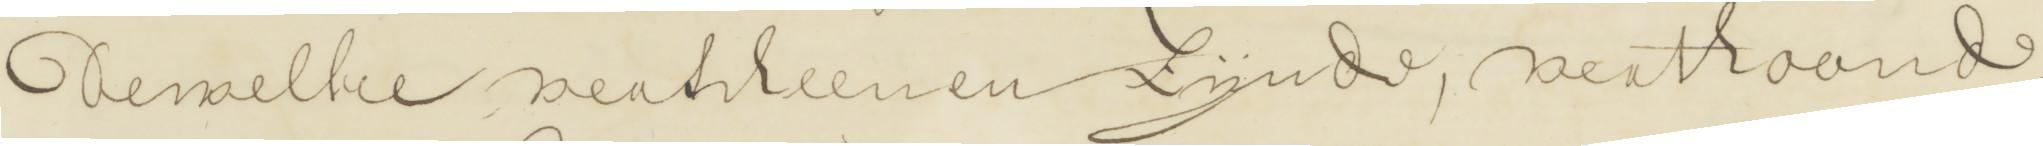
dewelke verscheenen zijnde, verthoonde
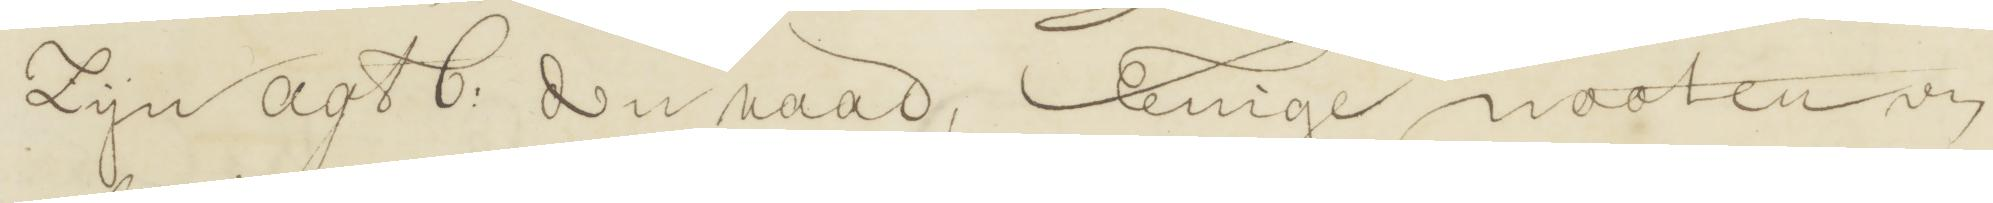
zijn agtb: den raad, Eenige nooten en
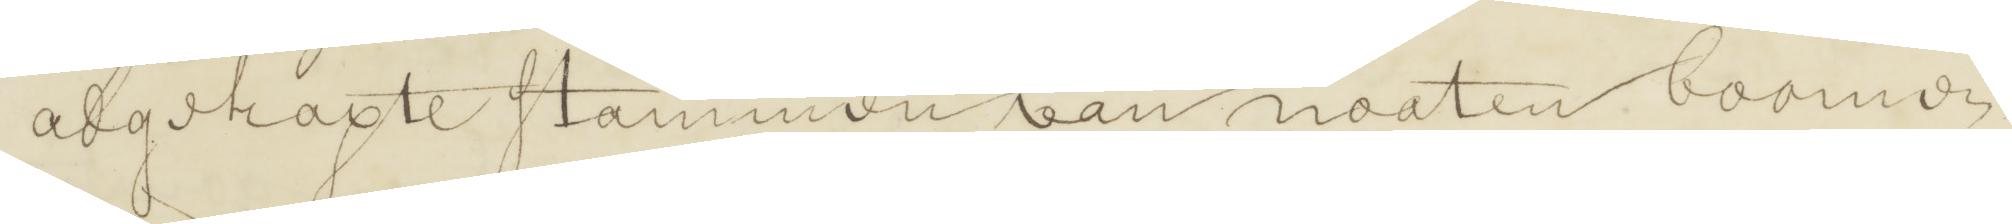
afgekapte stammen van noaten boomen
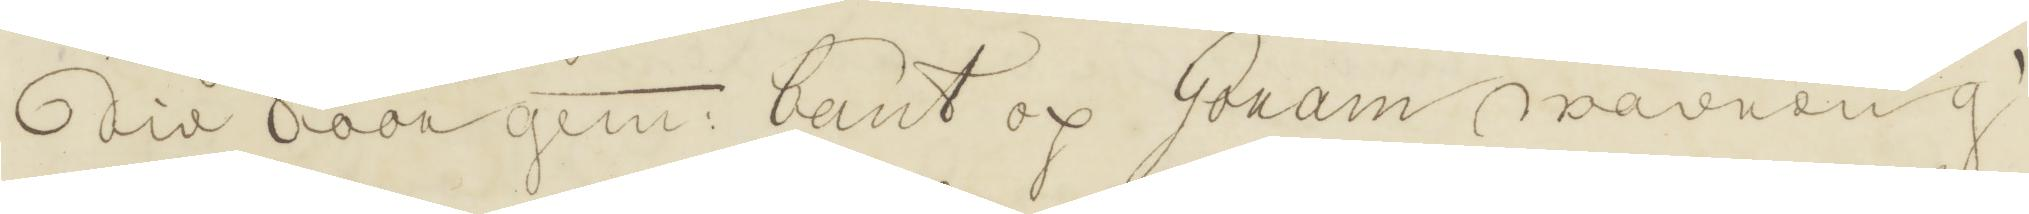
die door gem: baut op Goram waeren g
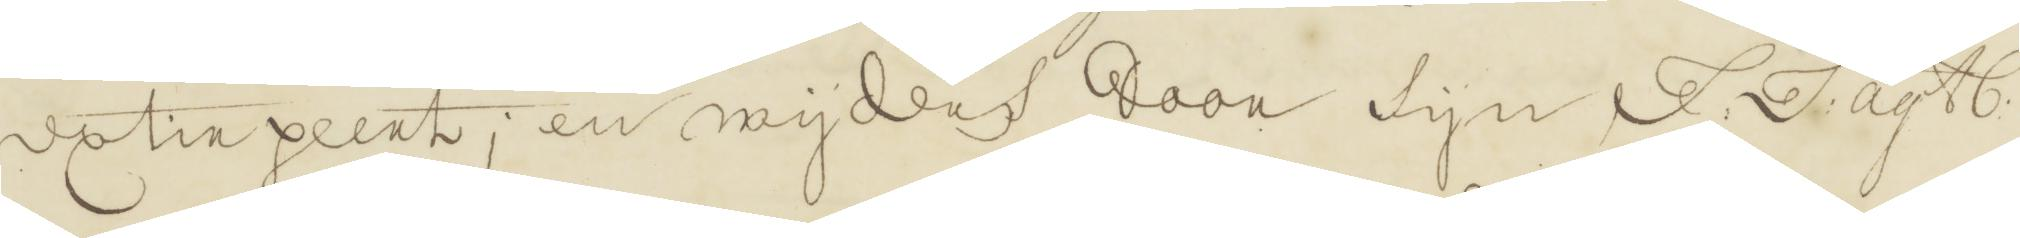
extirpeert, en wijders door sijn E: E: agtb:
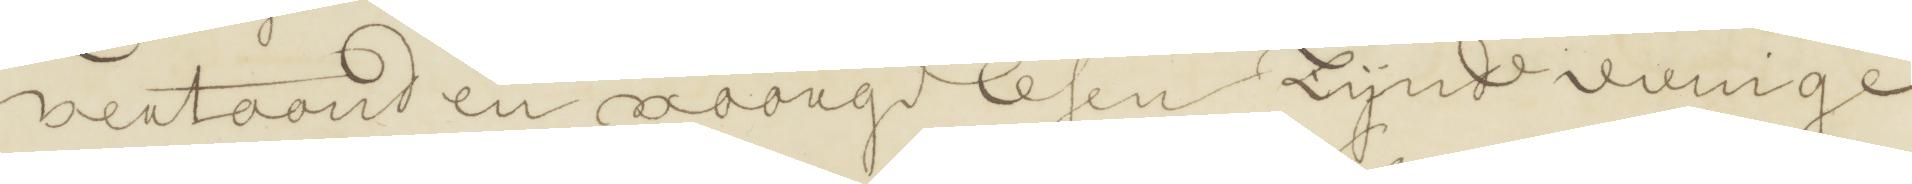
vertoond en voorgelesen zijnde eenige
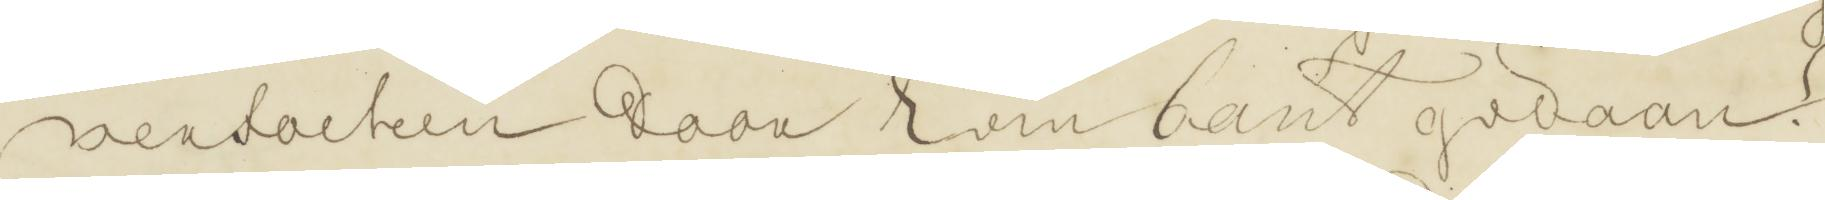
versoeken door hem baut gedaan.
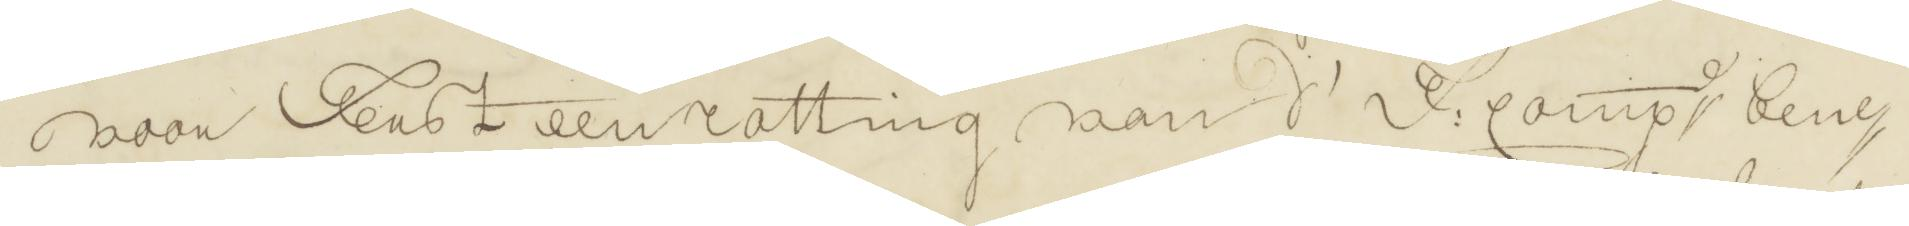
voor Eerst een ratting van d’ E: Comp„e bene„
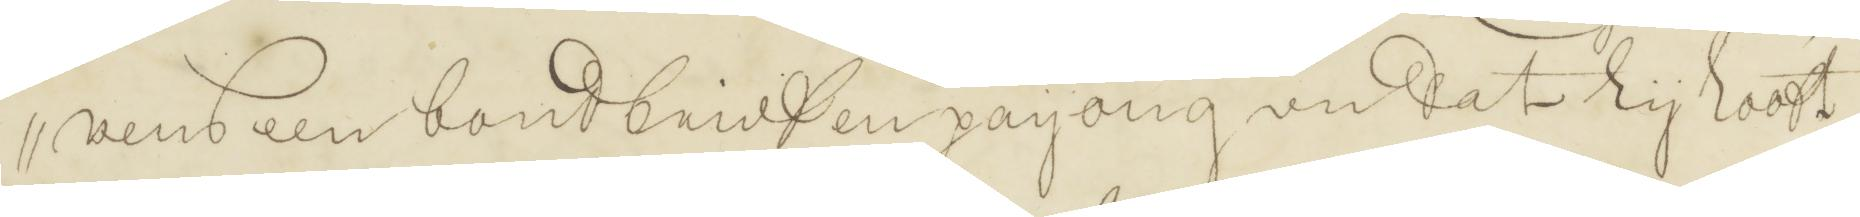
„vens een bondbrief en paijong en dat hij hooft
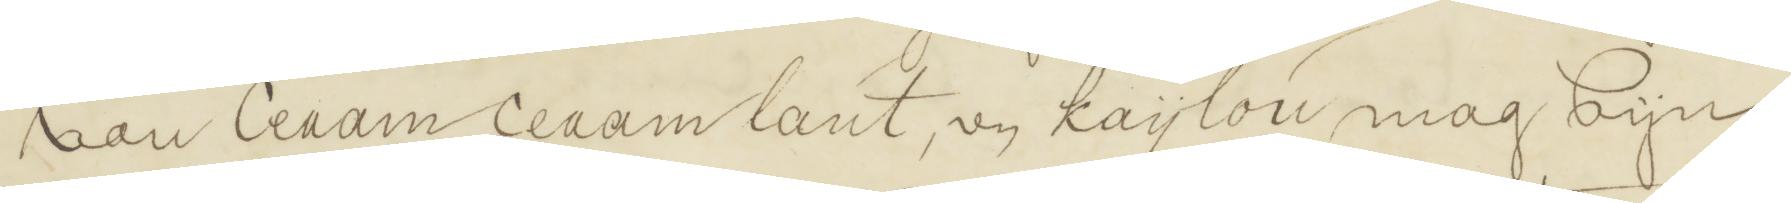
van Ceram ceram laut, en kaijlou mag zijn
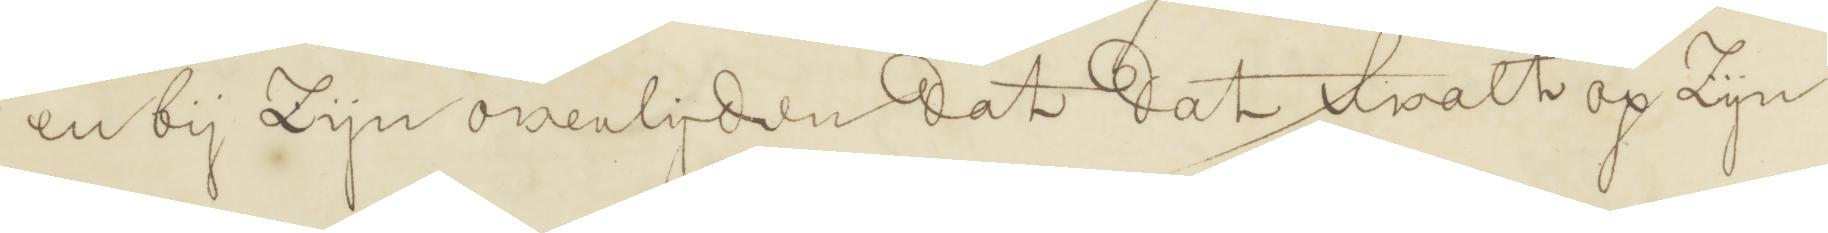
en bij zijn overlijden dat dat vervalt op zijn
